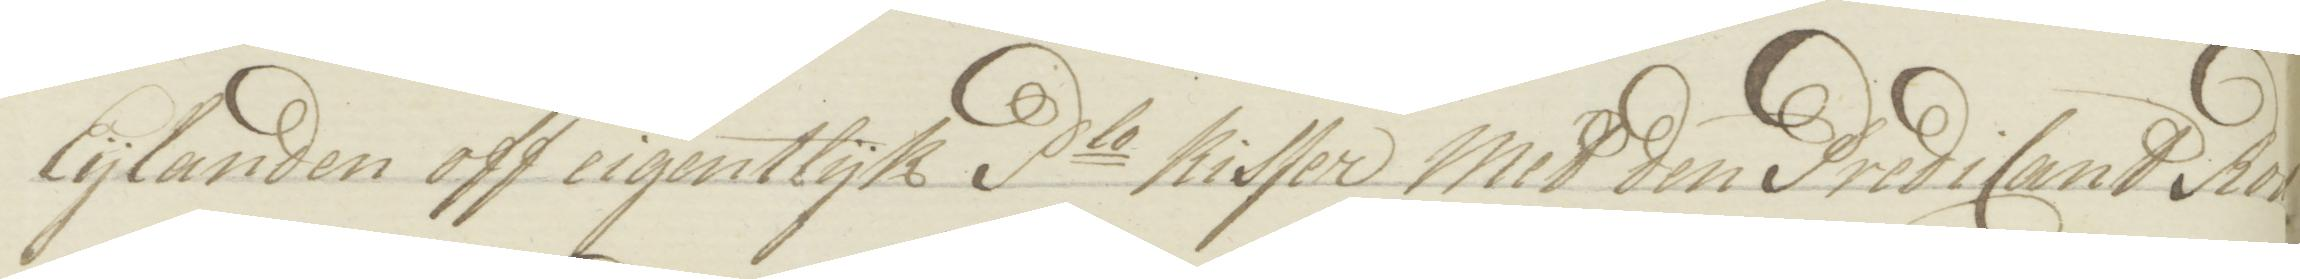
Eijlanden off eigentlijk P=lo kisser met den Predicant Ro
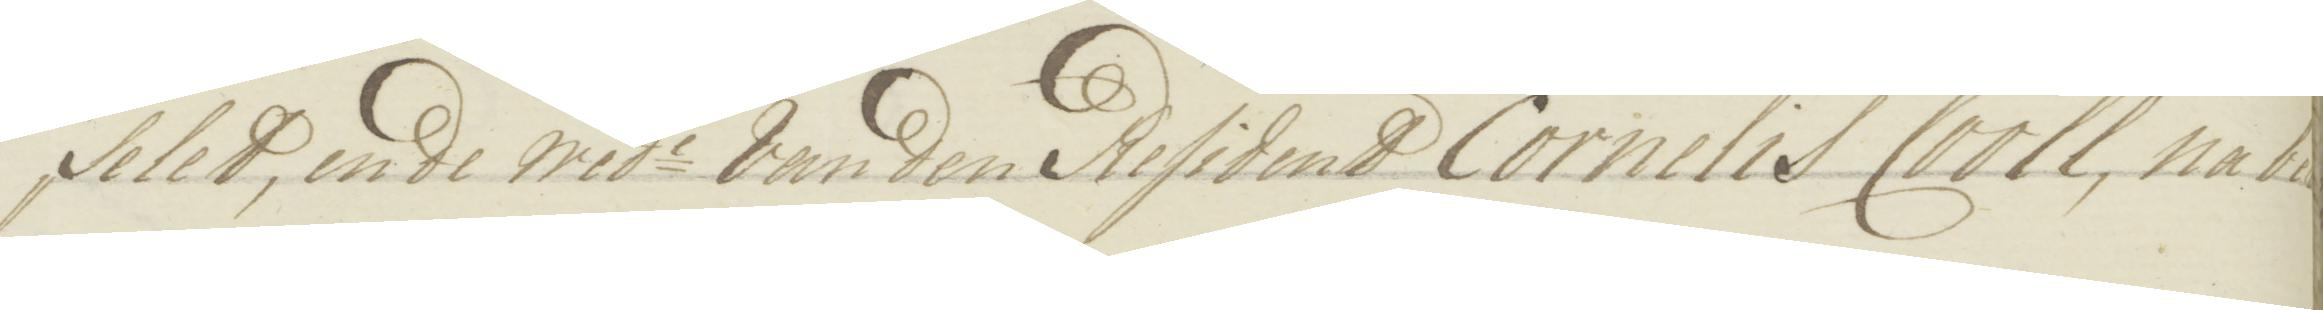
selet, en de wed=e van den Resident Cornelis Cooll, na be
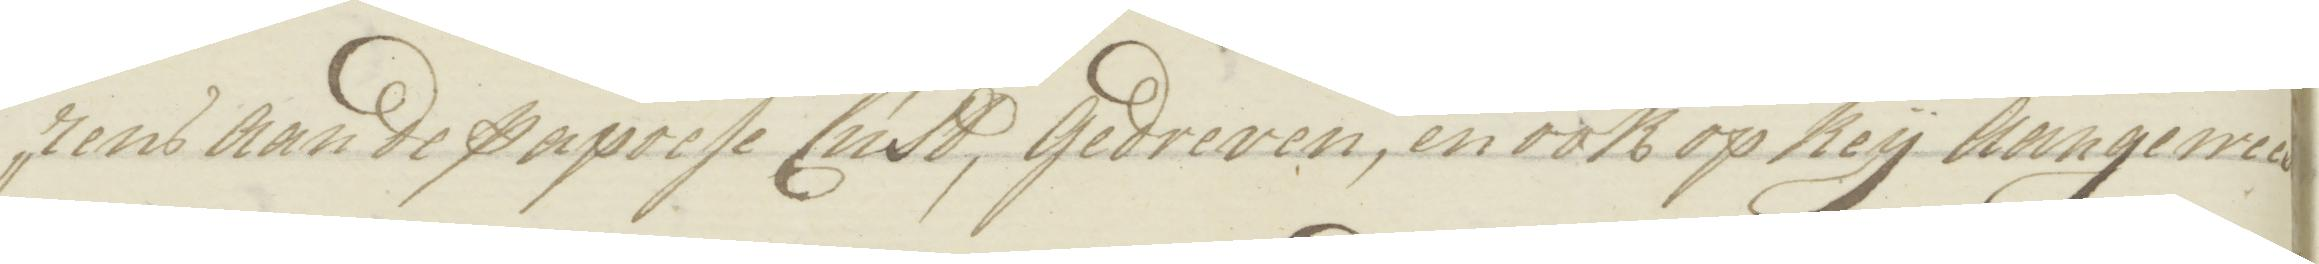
„rens aan de papoese Cust, gedreven, en ook op keij aangewee
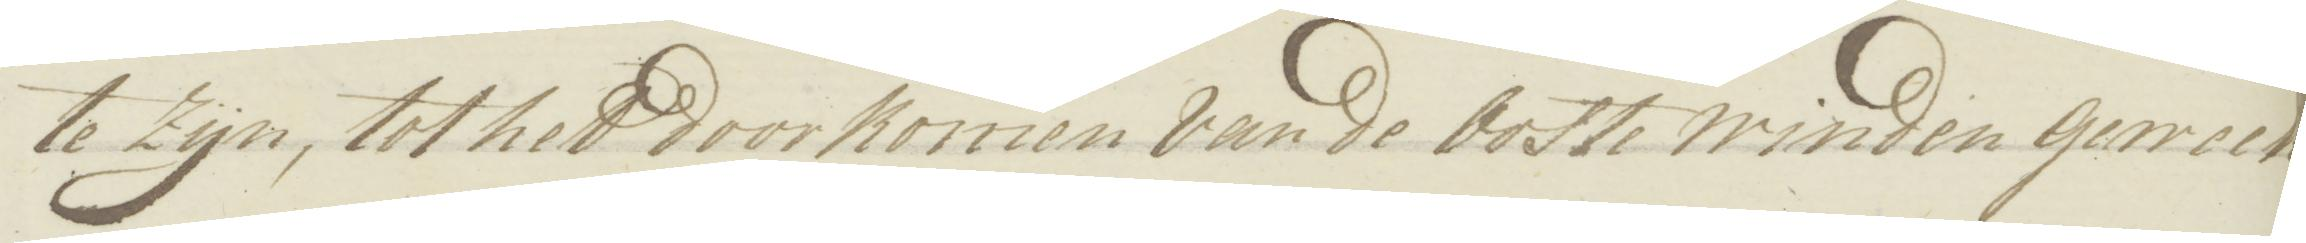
te zijn, tot het doorkomen van de Ooste winden gewee
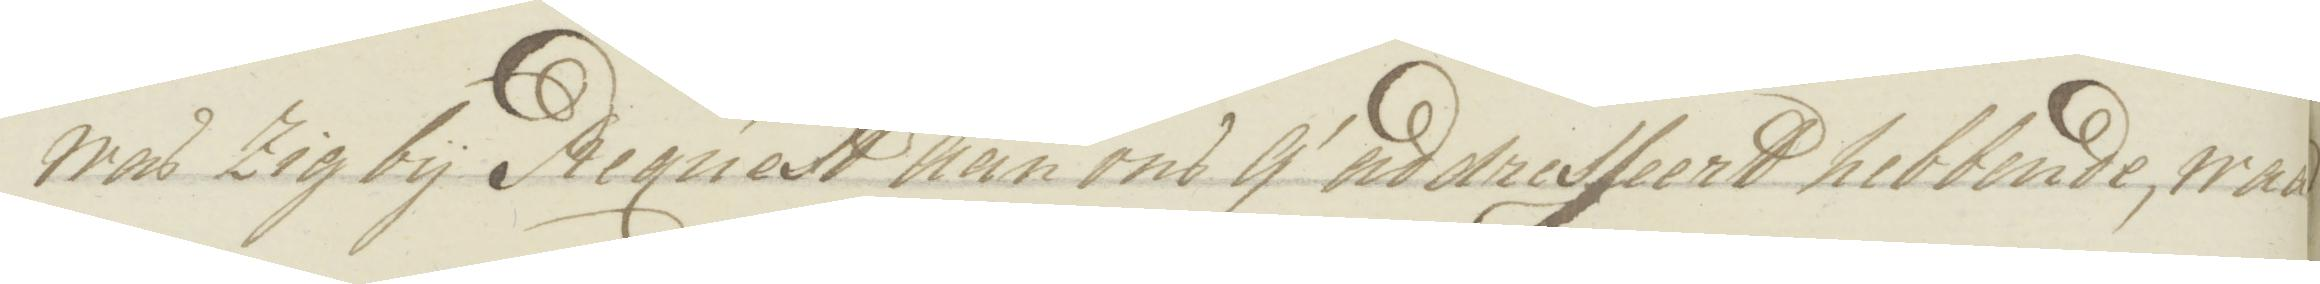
was zig bij Request aan ons g’addresseert hebbende, waa
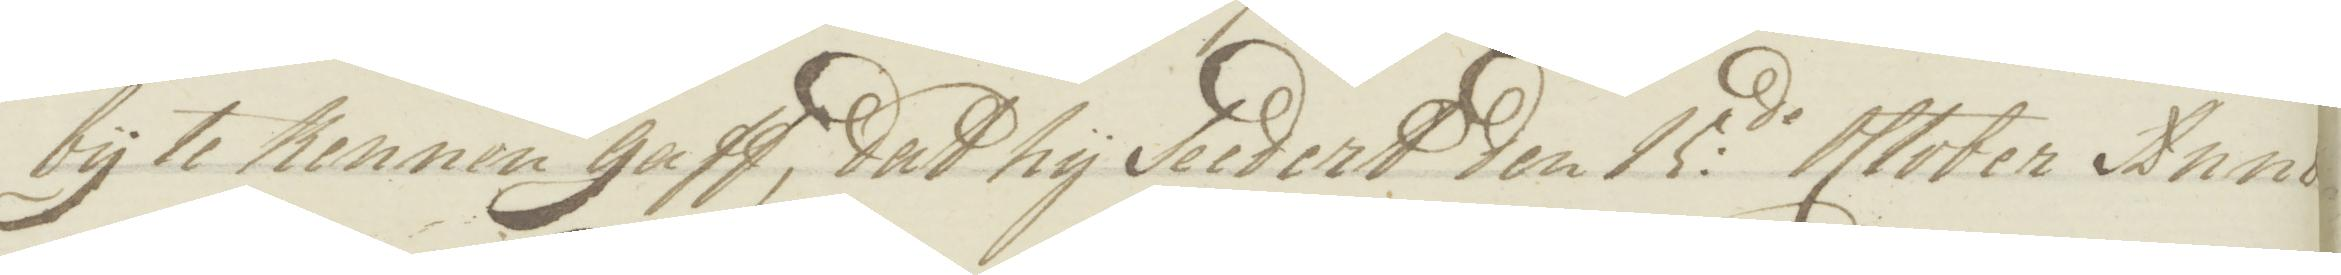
bij te kennen gaff, dat hij seedert den 15:de October Anno
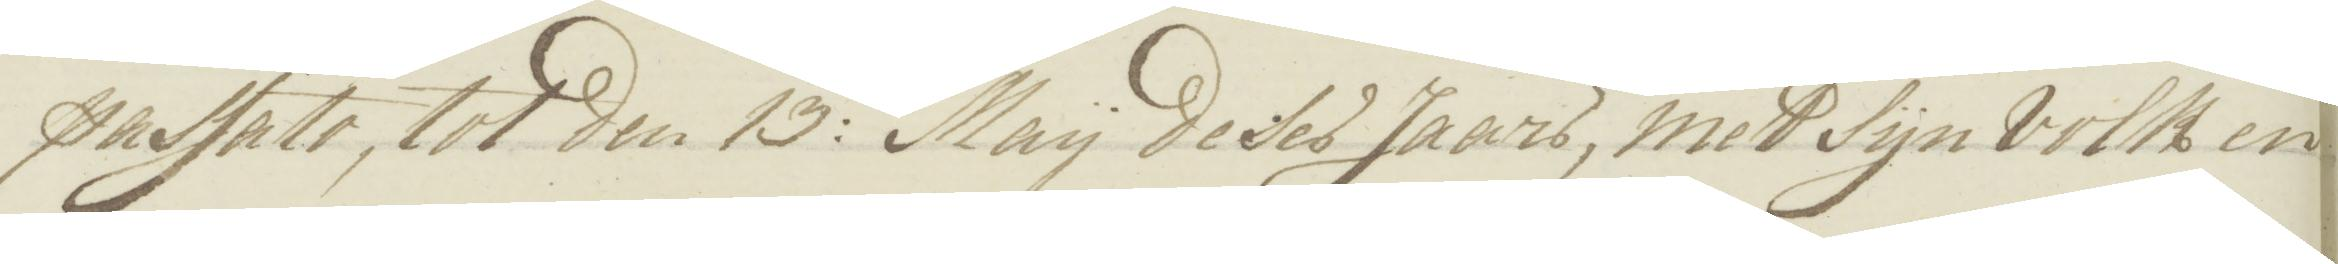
Passato, tot den 13: Maij deses Jaars, met sijn volk en
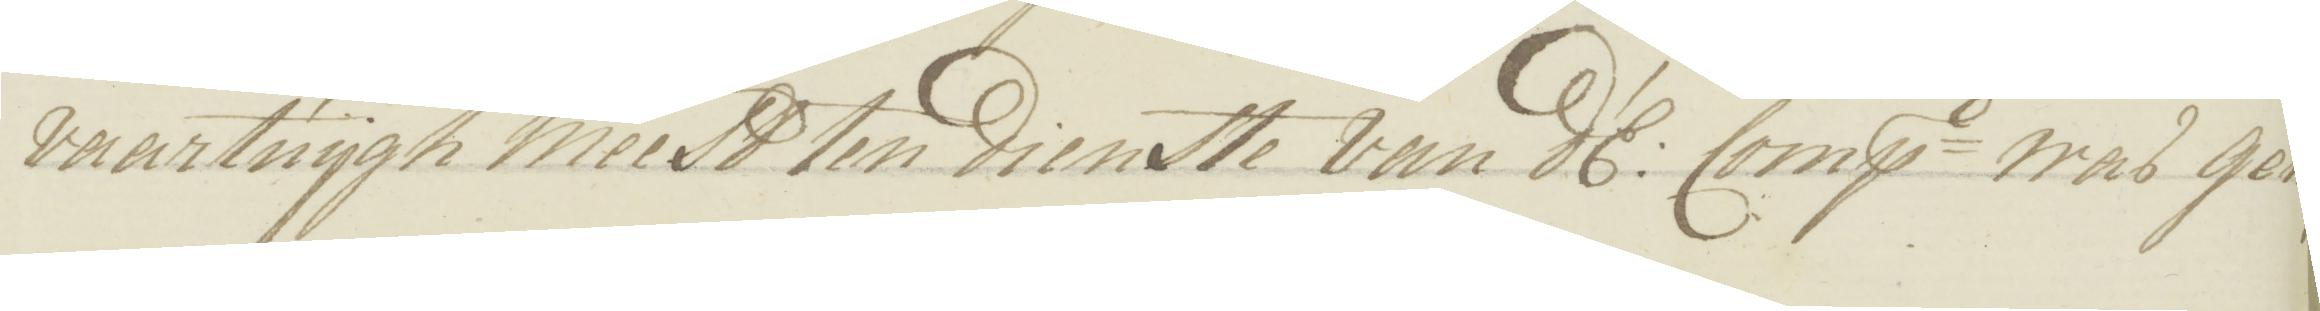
vaartuijgh meest ten dienste van d'E: Comp=e was ge
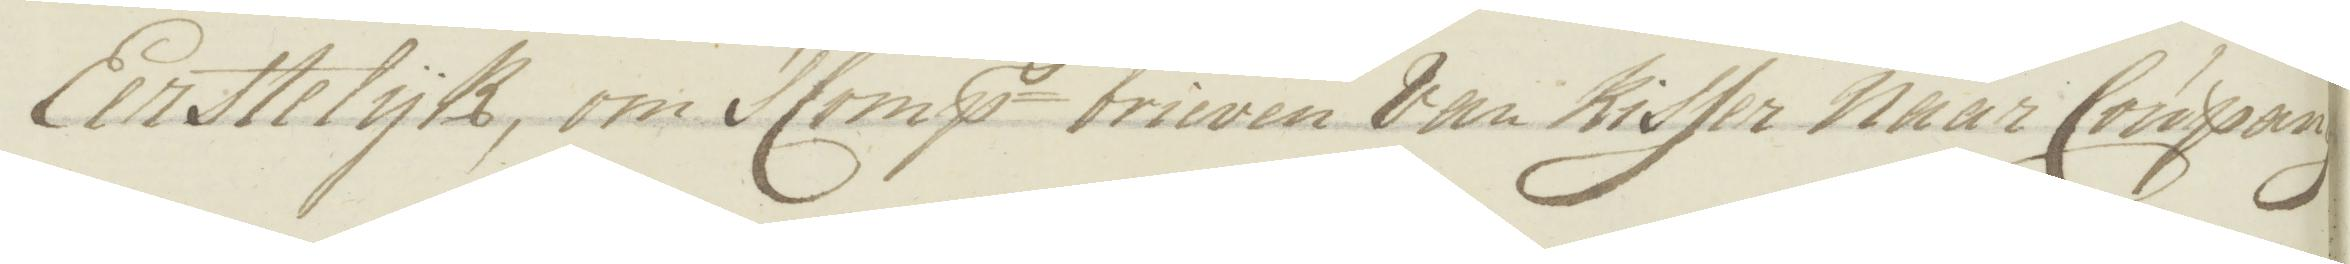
Eerstelijk, om ’s Comp=s brieven van kisser naar Coupan
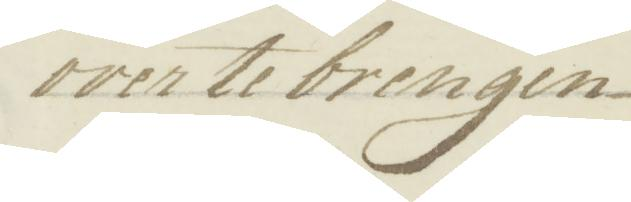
over te brengen
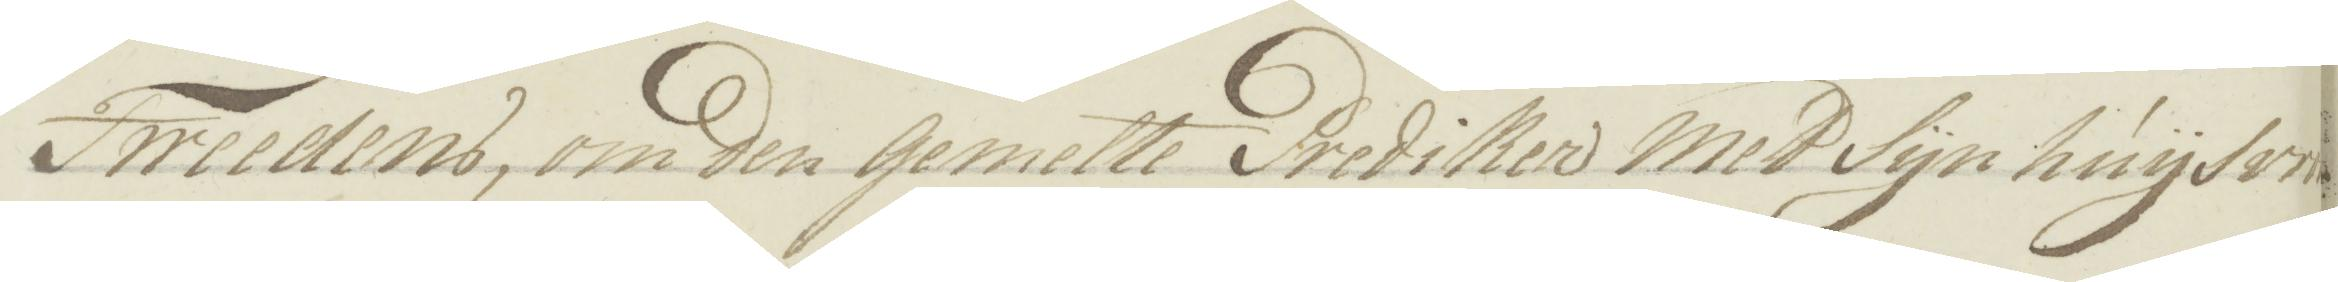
Tweedens, om den gemelte Prediker met sijn huijsvr
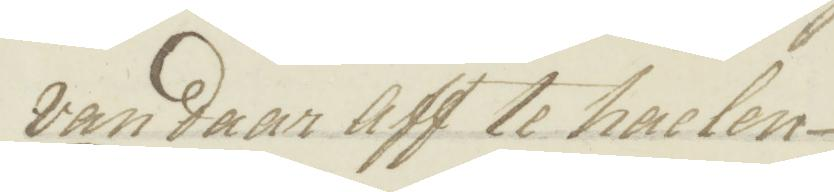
van daar aff te haelen
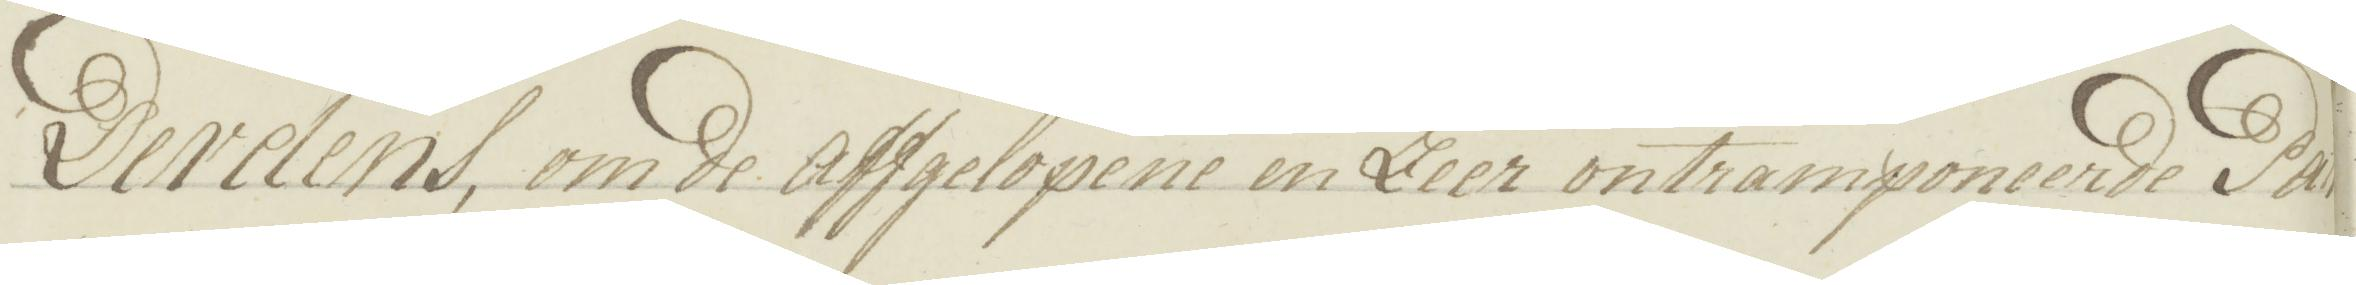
Derdens, om de affgelopene en zeer ontramponeerde Pa
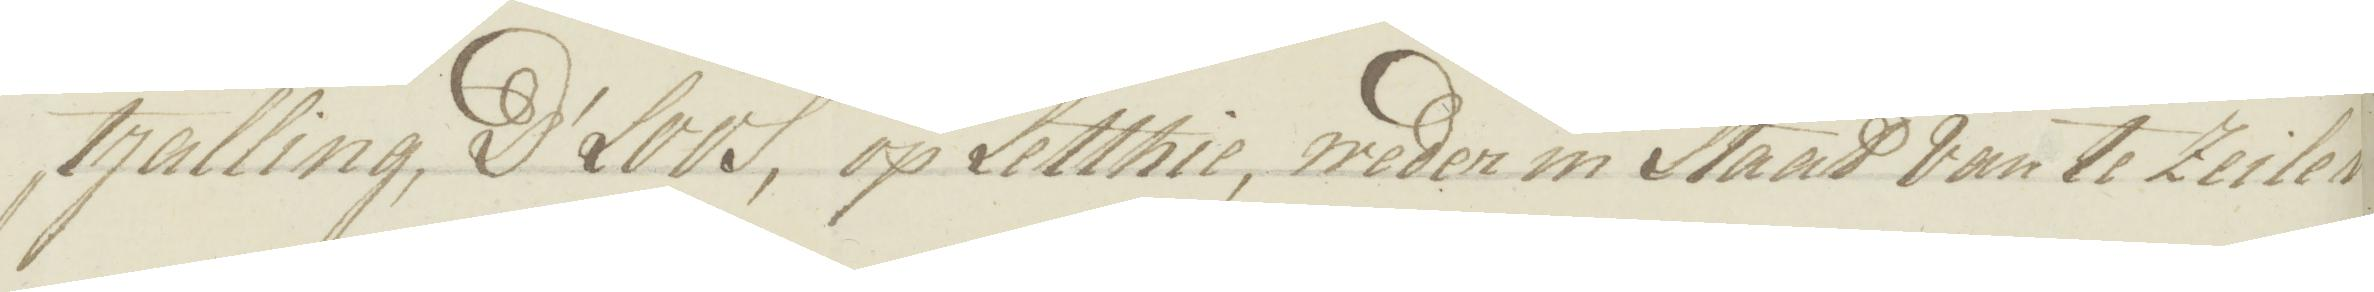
„tjalling, D' Loos, op Letthie, weder in staad van te zeilen
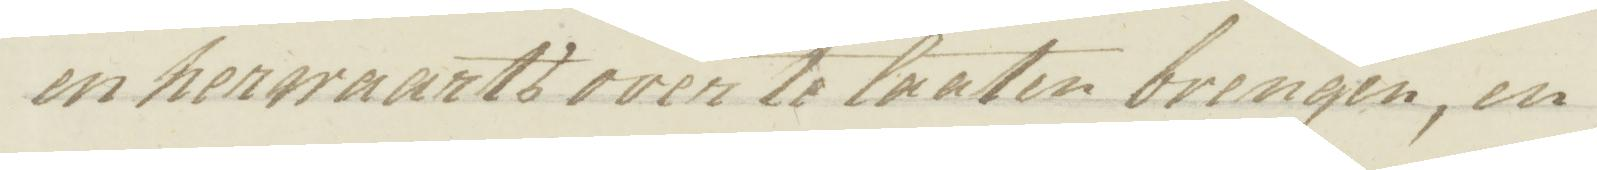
en herwaarts over te laaten brengen, en
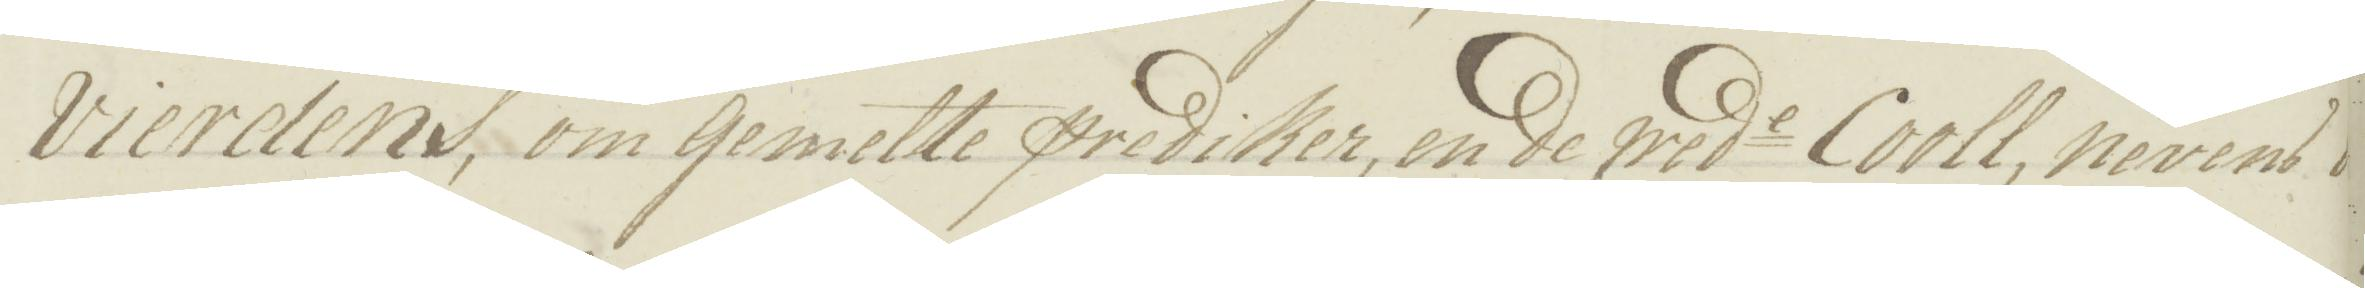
vierdens, om gemelte prediker, en de wed=e Cooll, nevens
